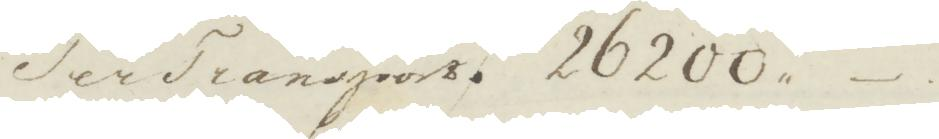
Per Transport ƒ 26200 „ —.
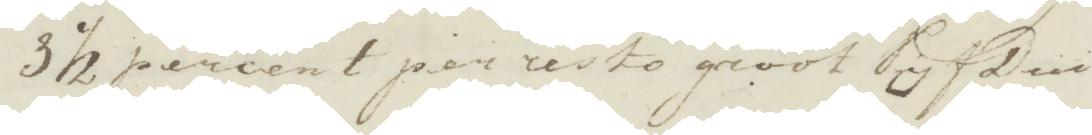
3½ percent per resto groot Vijƒ Dui
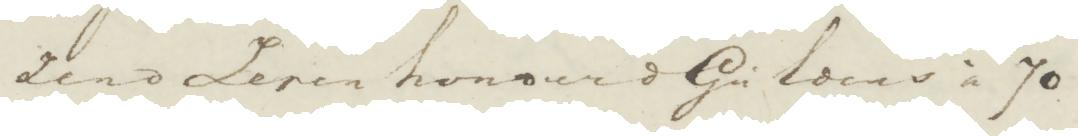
Zend Zeven honderd Guldens à 70
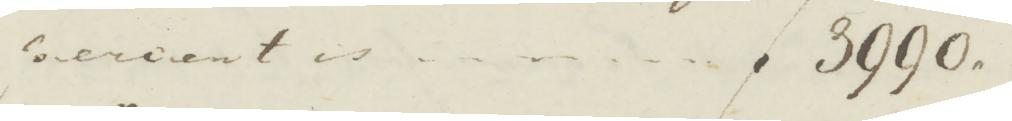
percent is...... ƒ 3990 „
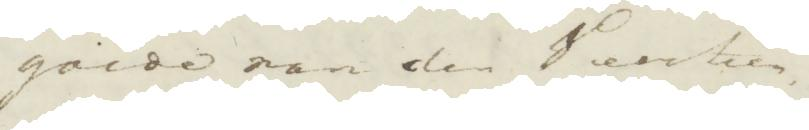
goede van den Veertien,
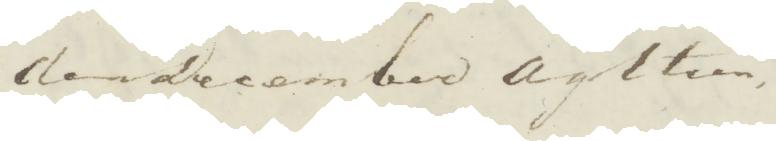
den December agttien,
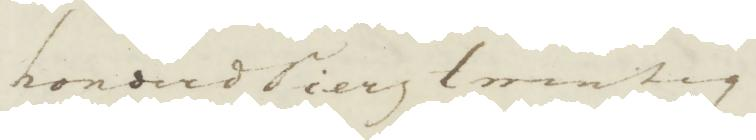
honderd Vierentwintig
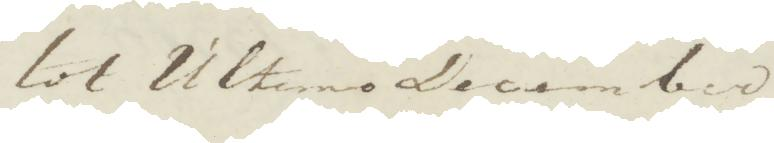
tot Ultimo December
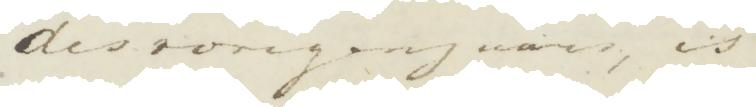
des vorigen jaars, is
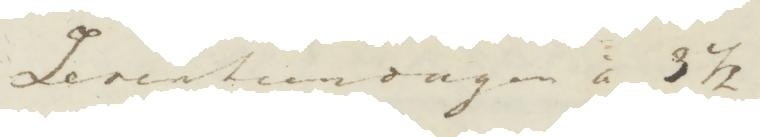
Zeventien dagen à 3½
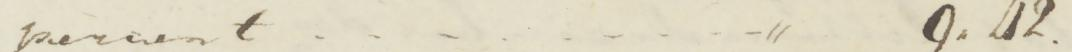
percent........ „ 9„ 42.
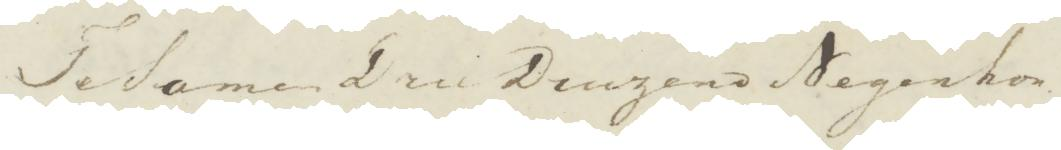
Tesamen Drie Duizend Negenhon
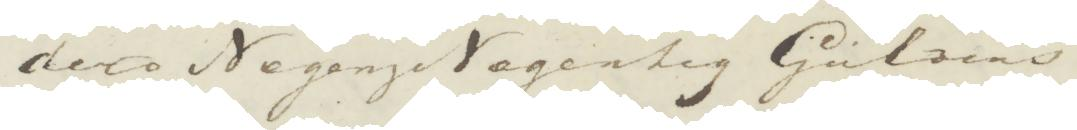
derd Negenen Negentig Guldens
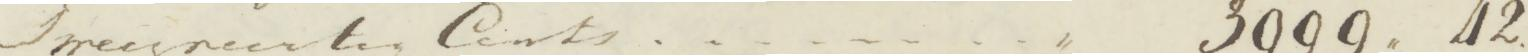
Tweeenveertig Cents .......„ 3999„ 42
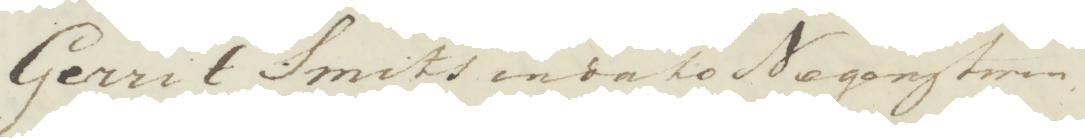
Gerrit Smits in dato Negenentwin
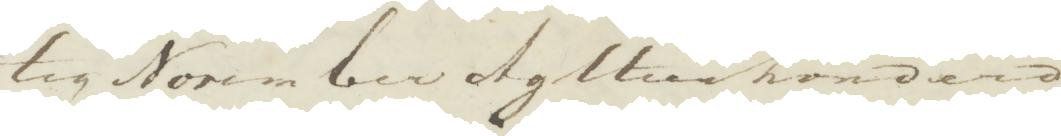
tig November Agttien honderd
